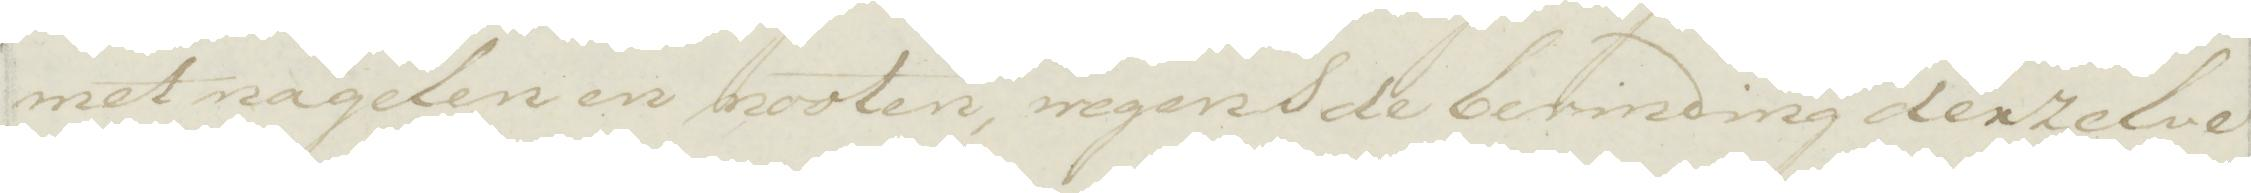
met nagelen en nooten, wegens de bevinding derzelve
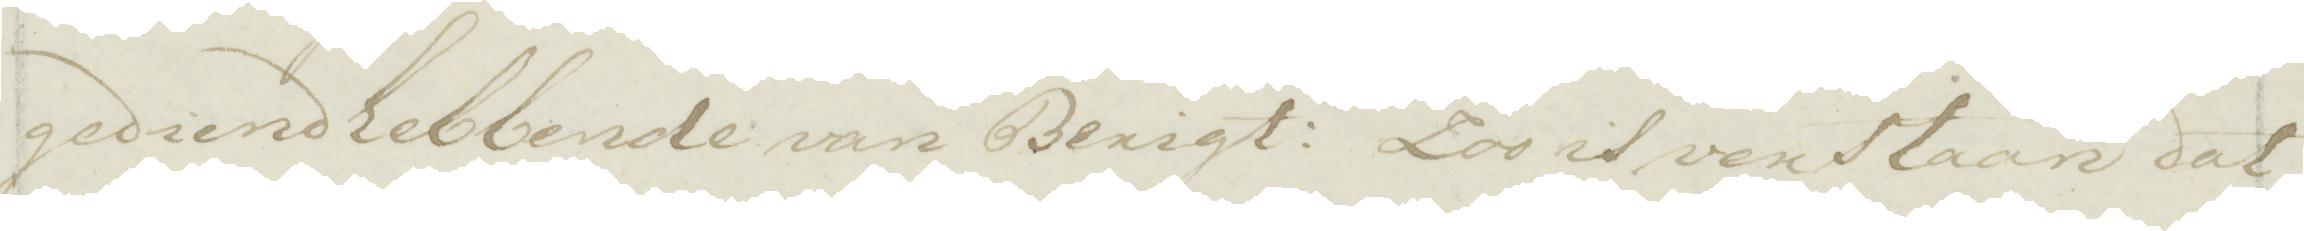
gediend hebbende van Berigt: zoo is verstaan dat
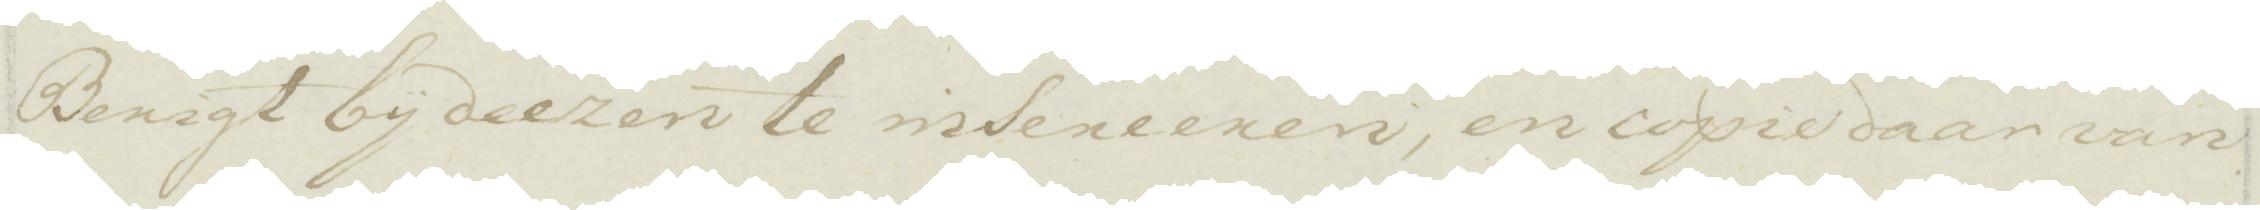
Berigt bij deezen te insereeren, en copie daar van
